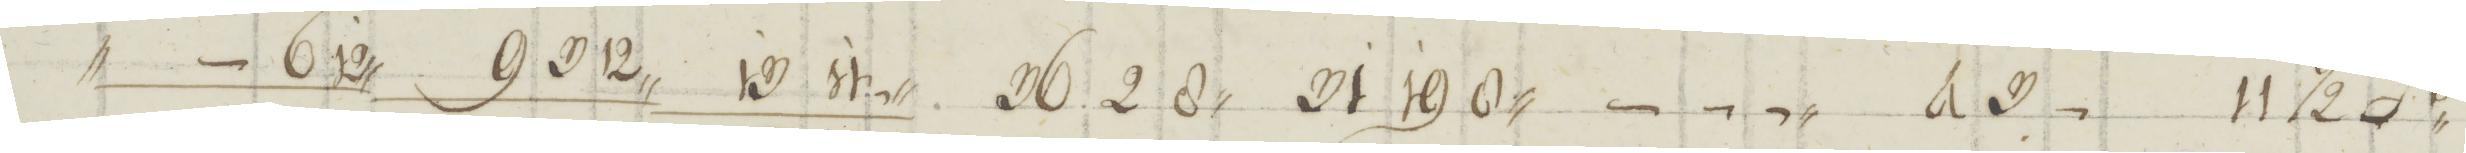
„ — 6 12„ 9 3 12„ 13 11.-„ 36 2 8„ 31 19 8„ — — —„ 4 3 — 11½ p„s
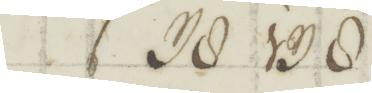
ƒ 38 13 8
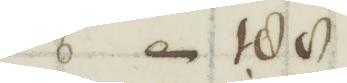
ƒ — 18 8
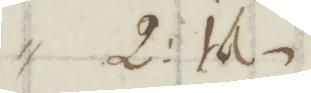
„ 2: 14 —
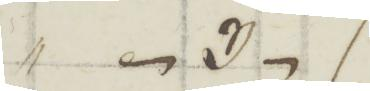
„ — 3 —
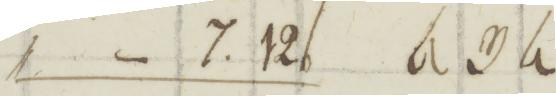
„ — 7. 12ƒ 4 3 4
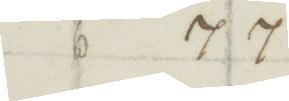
ƒ 7 7
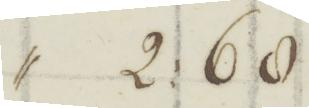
„ 2: 6 8
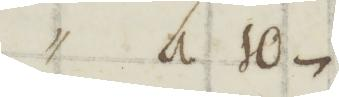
„ 4 10 —
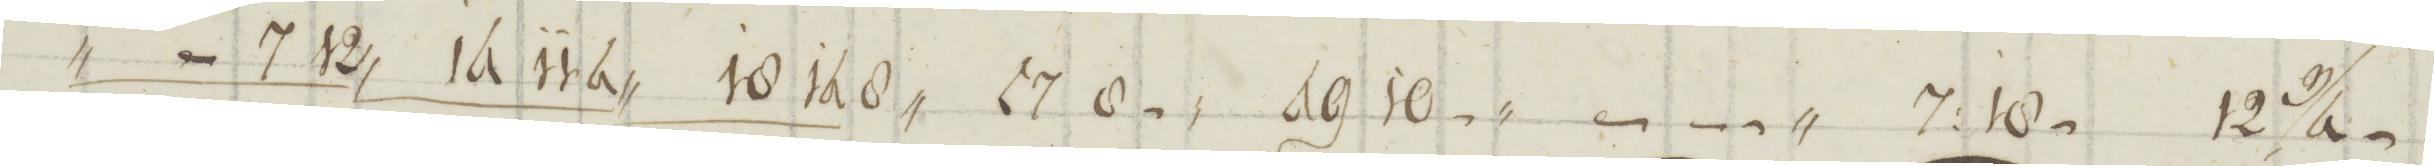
„ — 7 12„ 14 11 4„ 18 14 8 „ 57 8 – „ 49 10 – „ — — – „ 7: 18– 12¾ –
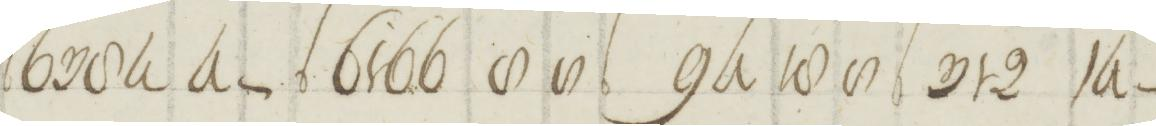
ƒ6384 4 – ƒ 6166 8 8 ƒ 94 18 8 ƒ 312 14
